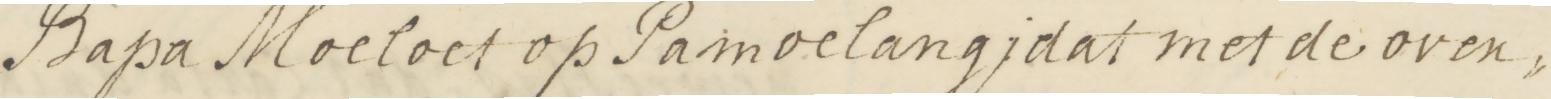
Bapa Moeloet op Pamoelang; dat met de over„
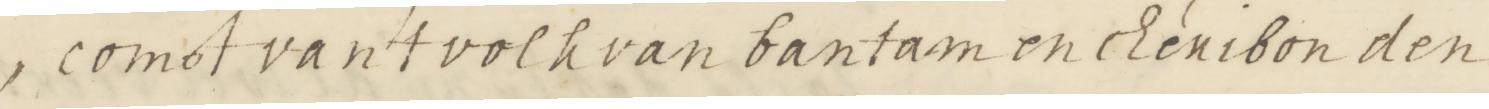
„ comst van 't volk van bantam en cheribon den
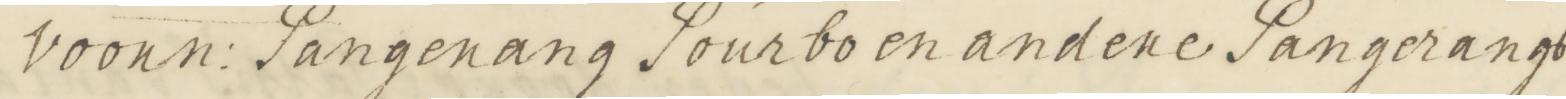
voorn: Pangenang Pourbo en andere Pangerangs
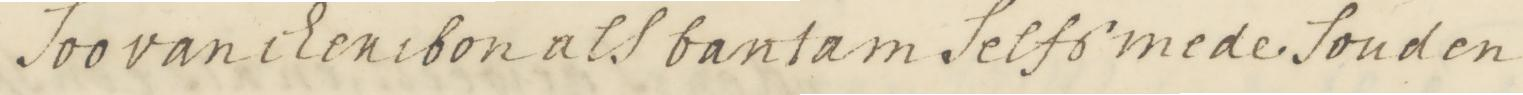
soo van cheribon als bantam selfs mede souden
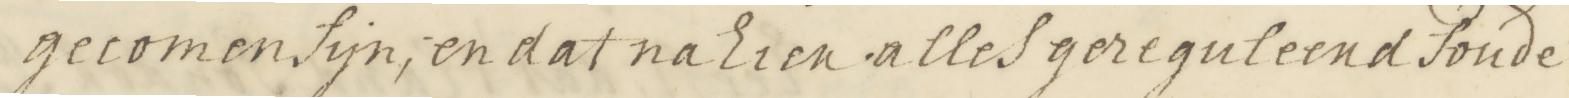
gecomen sijn, en dat na hier alles gereguleerd soude
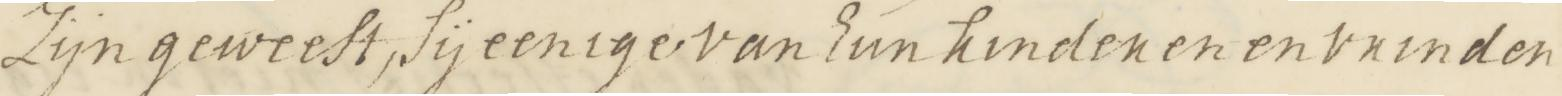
zijn geweest, sij eenige van hun kinderen en vrinden
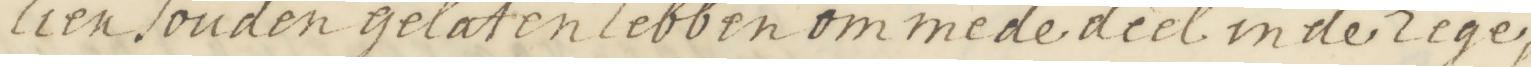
hier souden gelaten hebben om mede deel in de rege
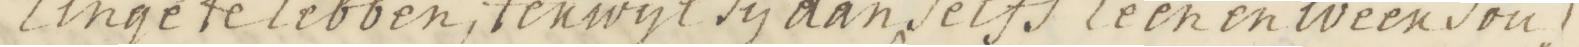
ringe te hebben; terwijl sij dan ^ selfs heen en weer sou„
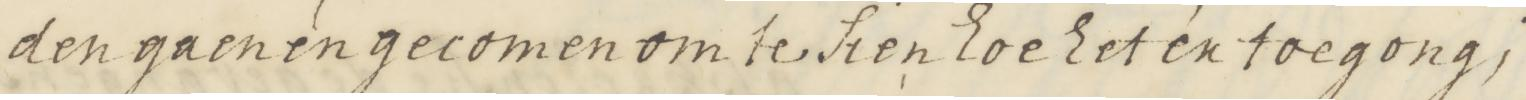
den gaen en gecomen om te sien hoe het in toegong;
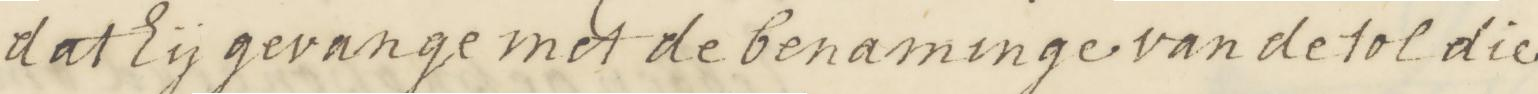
dat hij gevangen met de benaminge van de tol die
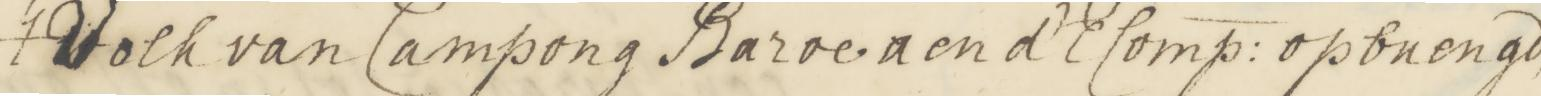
't Volk van Campong Baroe aen d'EComp: opbrengd,
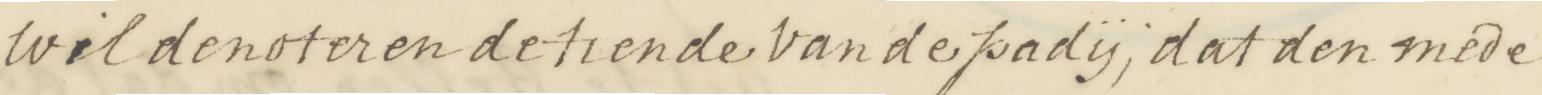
wil denoteren de tiende van de padij; dat den mede
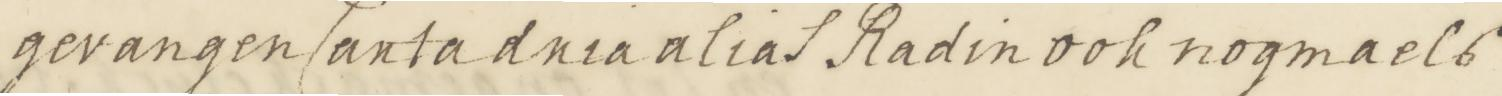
gevangen Cantadria alias Radin ook nogmaels
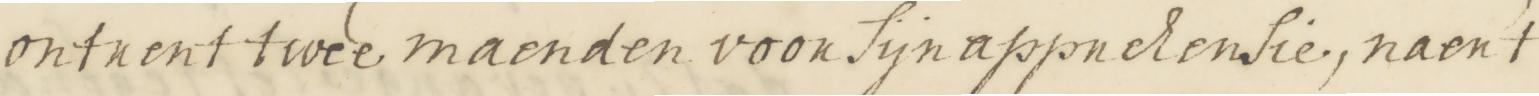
ontrent twee maenden voor sijn apprehensie, naer 't
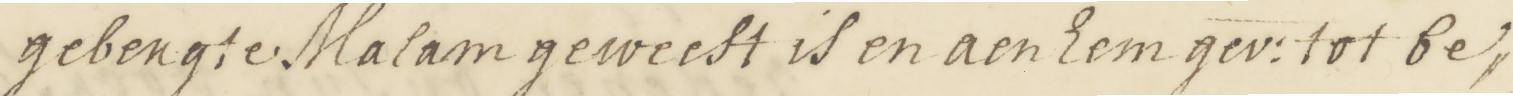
gebergte Halam geweest is en aen hem gev: tot be„
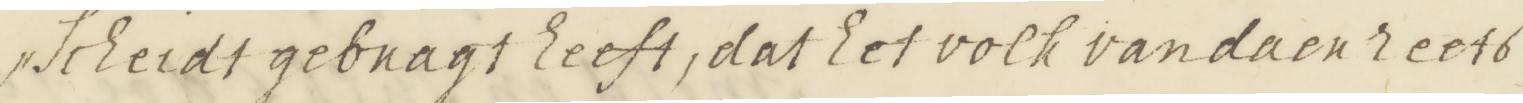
„scheidt gebragt heeft, dat het volk van daer reets
